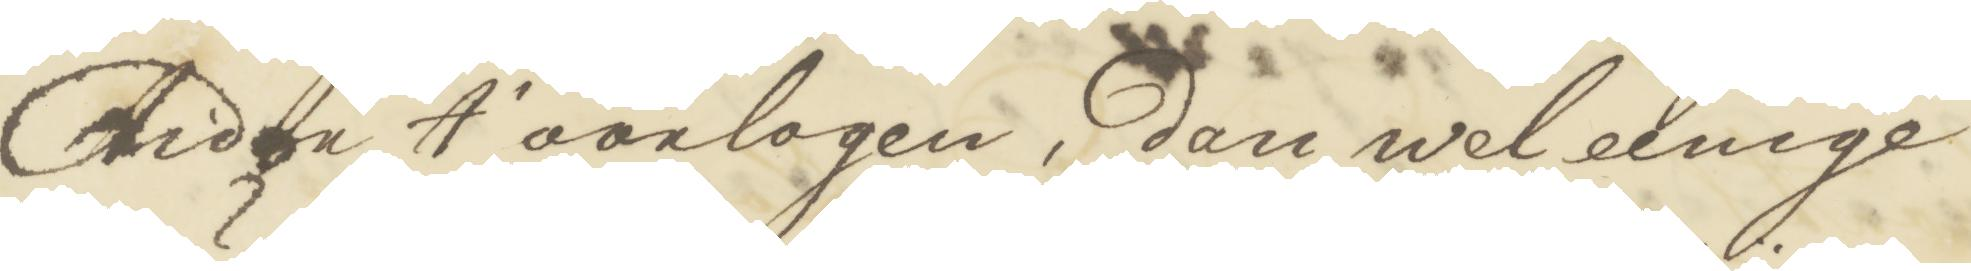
Tidor t' oorlogen, dan wel eenige
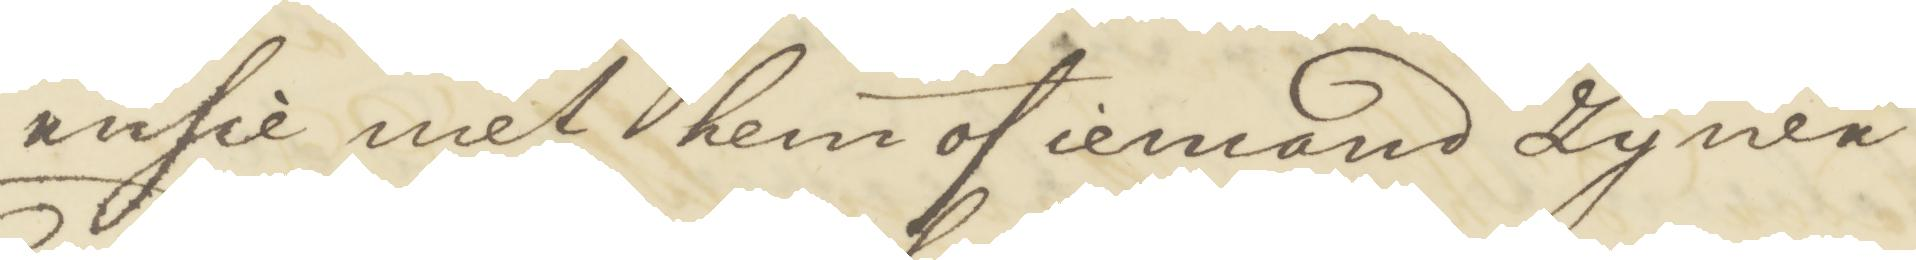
rusie met hem of iemand zijner
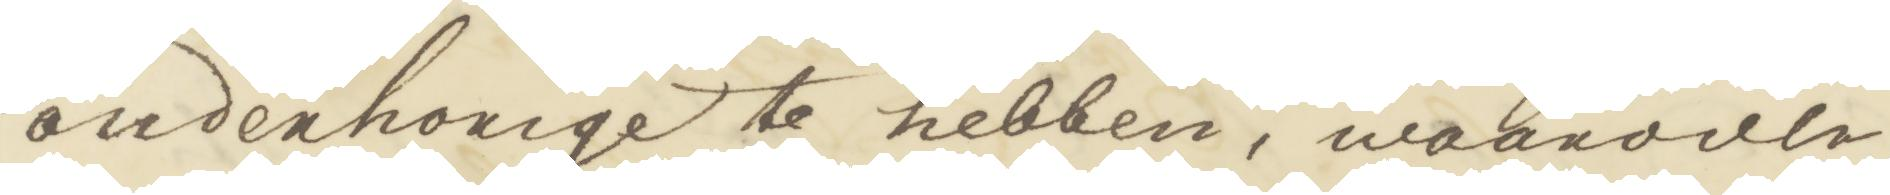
onderhorige te hebben, waarover
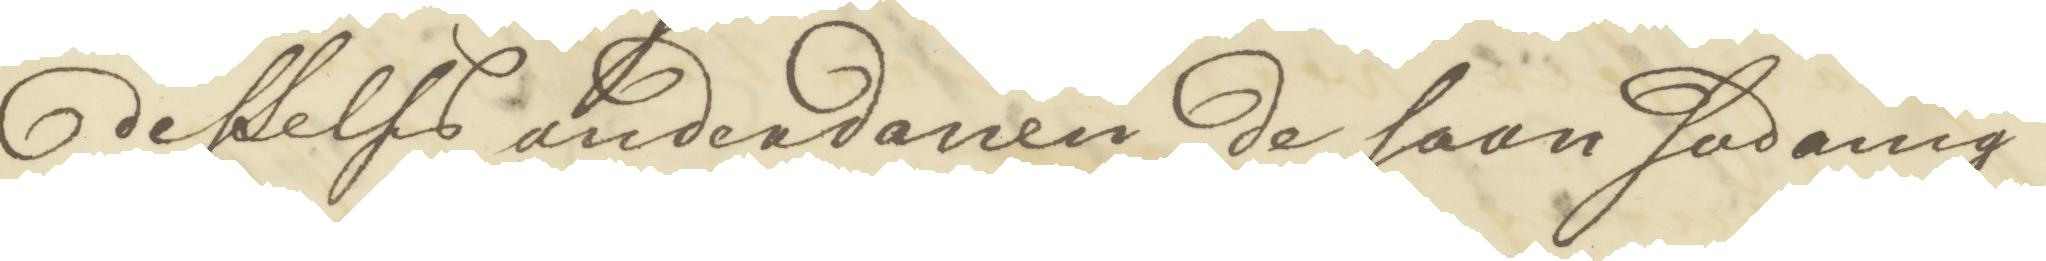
desselfs onderdanen de soon sodanig
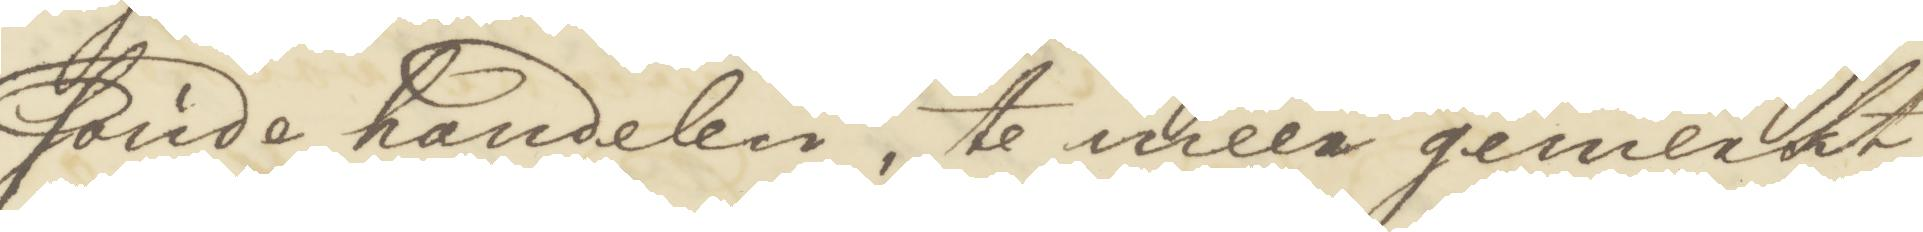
soude handelen, te meer gemerkt
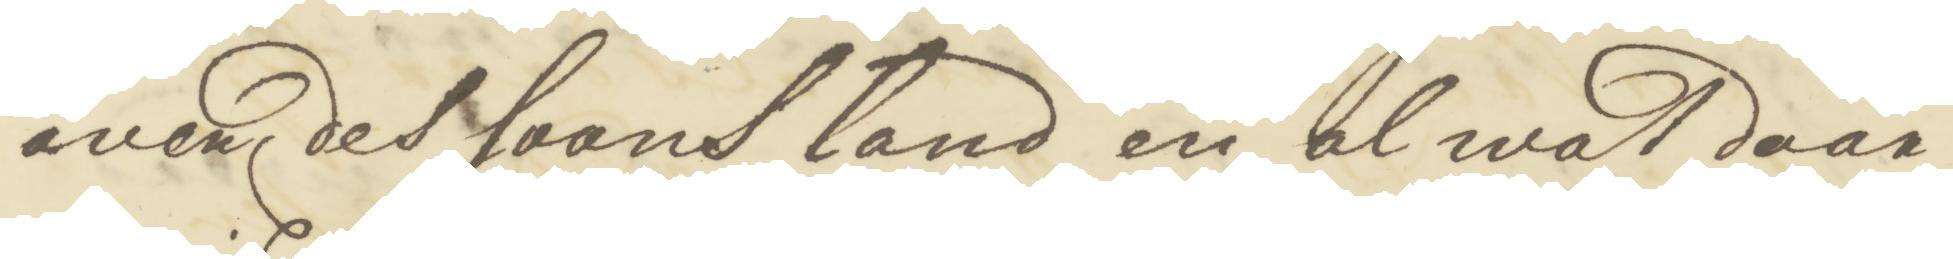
over des soons land en al wat daar
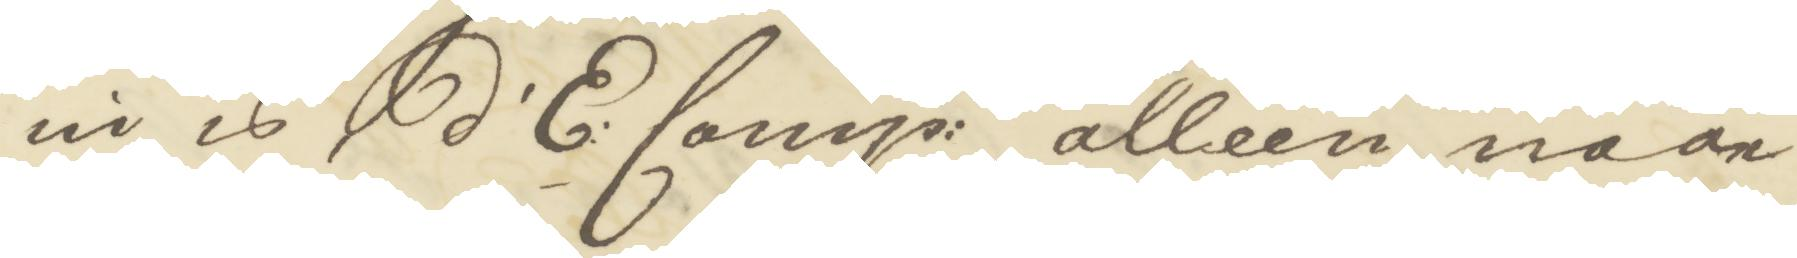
in is d’E: Comp: alleen naar
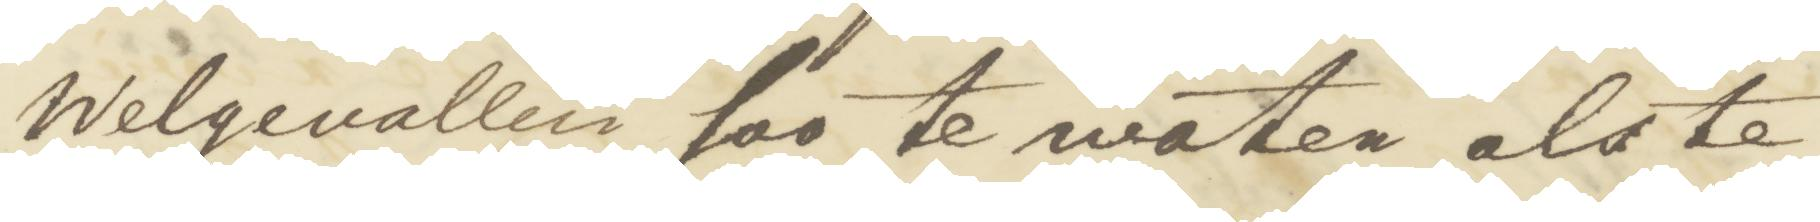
wel gevallen soo te water als te
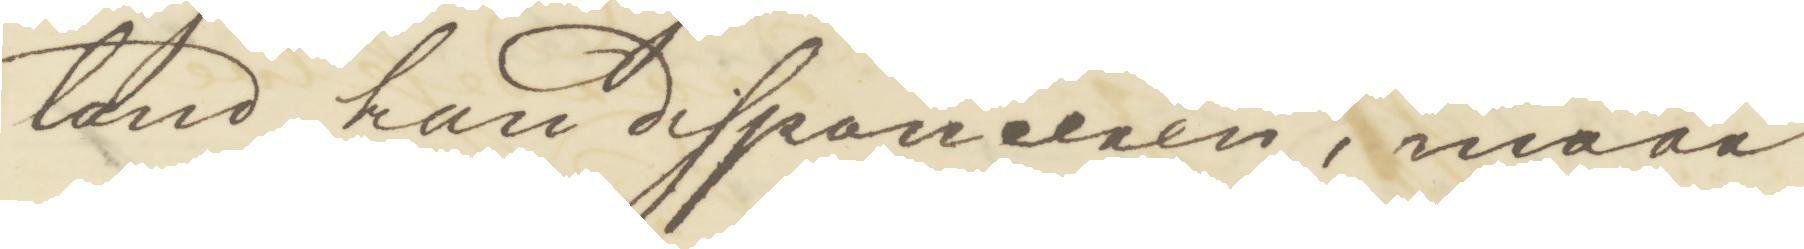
land kan disponeeren, maar
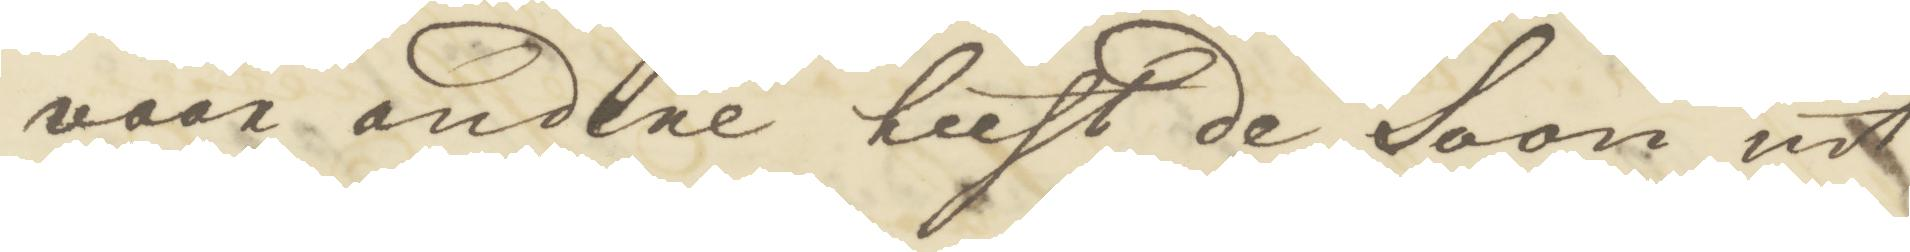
voor andere heeft de soon in't
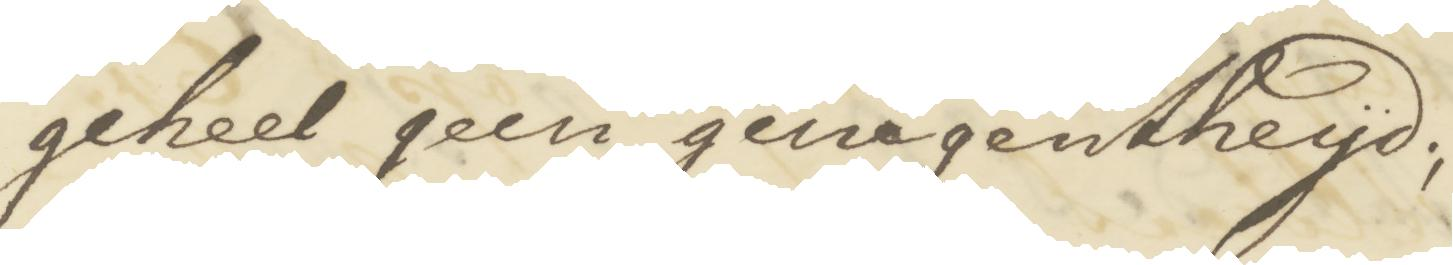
geheel geen genegentheijd;
